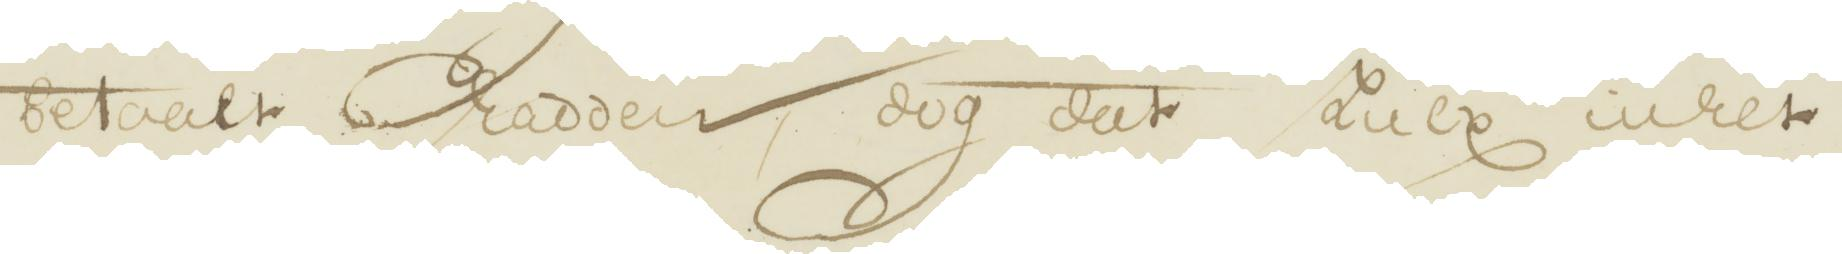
betaalt hadden, dog dat zulx in het
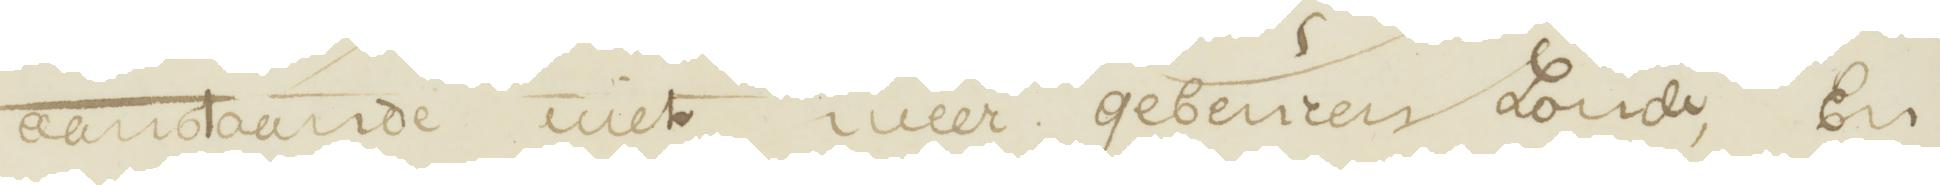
aanstaande niet meer gebeuren zoude, En
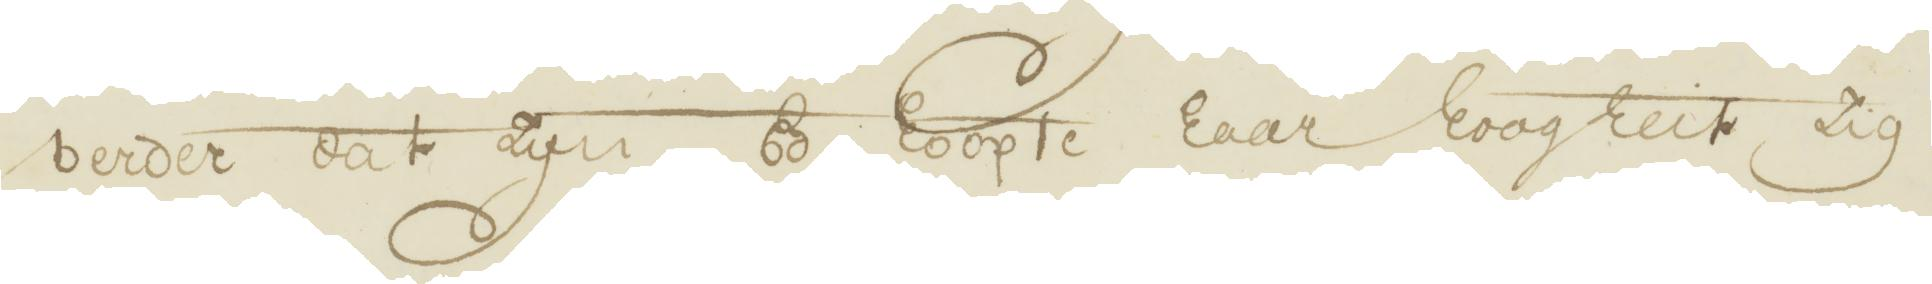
verder dat zyn Ed hoopte haar hoogheit zig
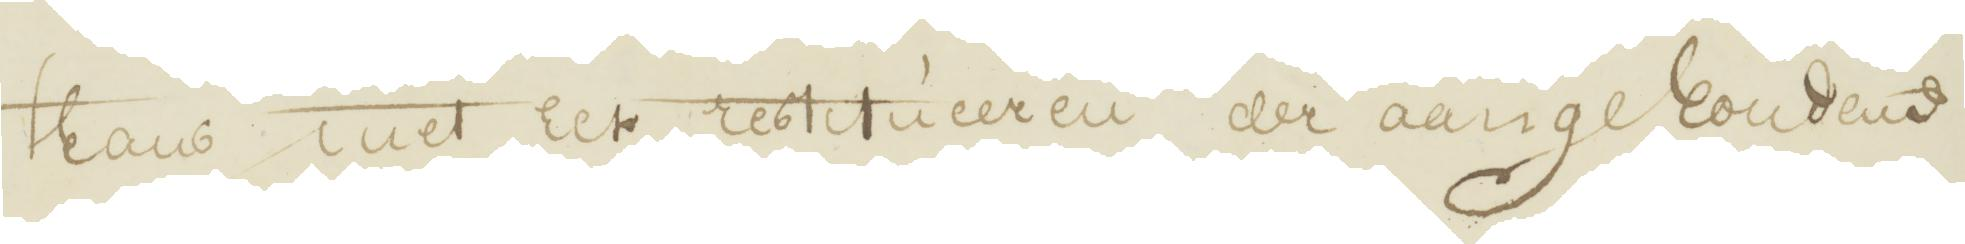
thans met het restitueeren der aangehoudene
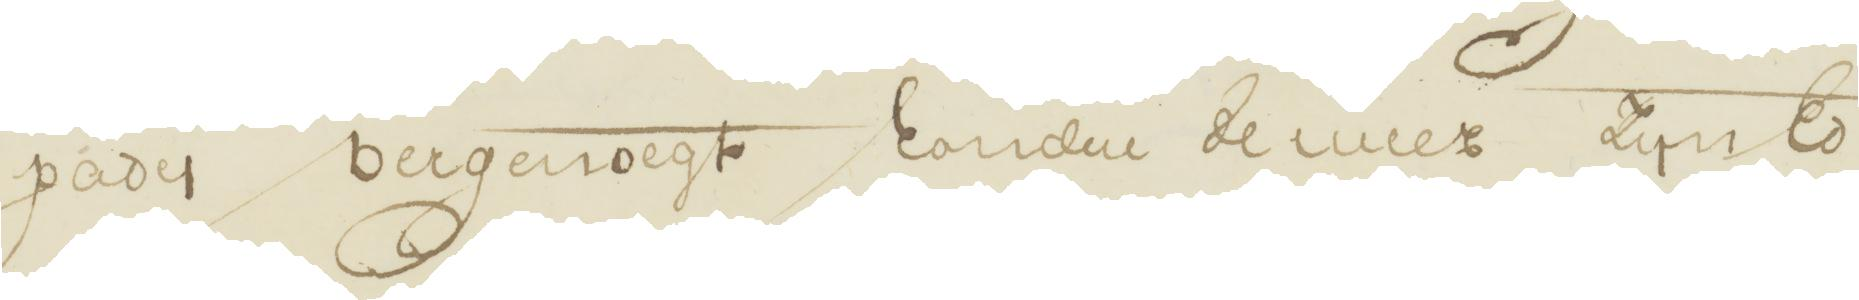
pady vergenoegt houden demeer zyn Ed
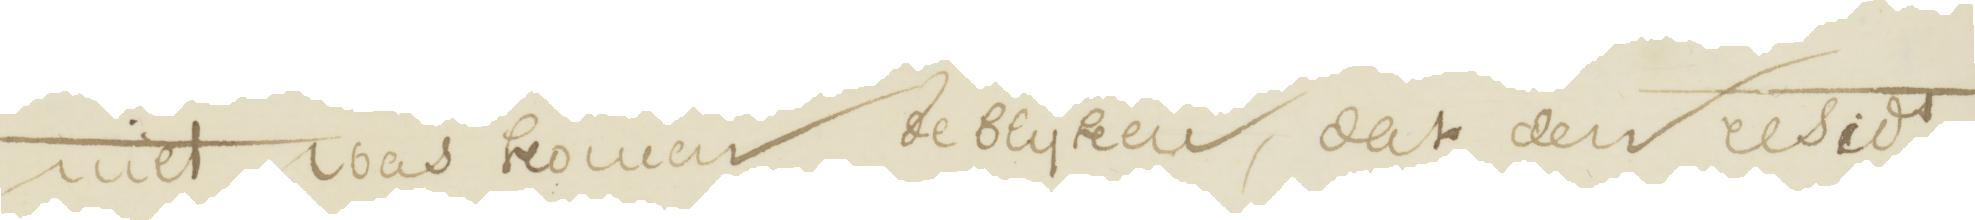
niet was komen teblyken, dat den resid=t
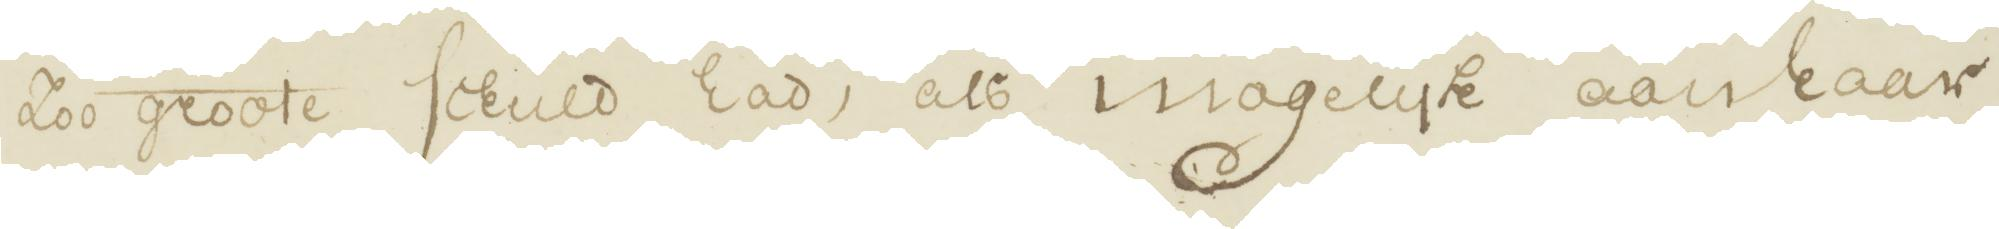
zoo groote schuld had, als mogelijk aan haar
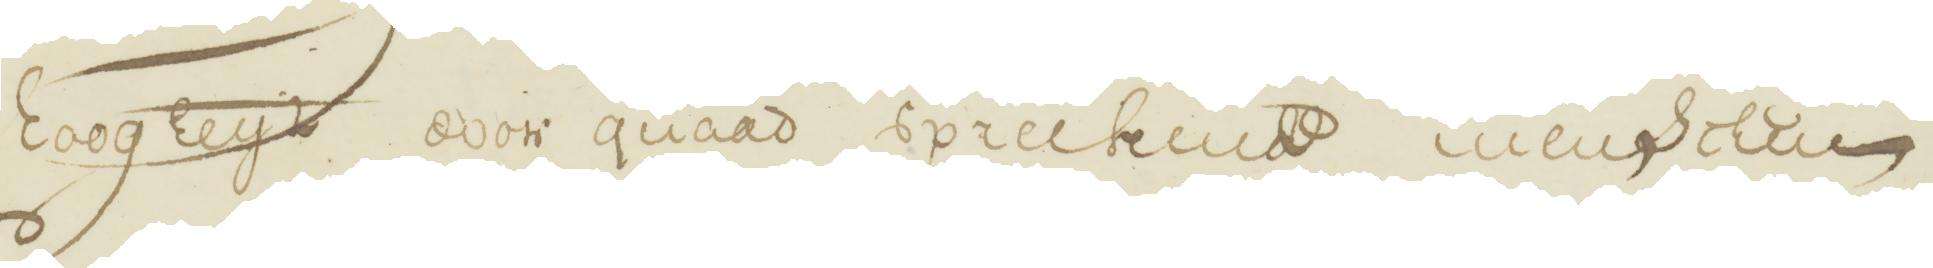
hoogheijt door quaad spreekende menschen
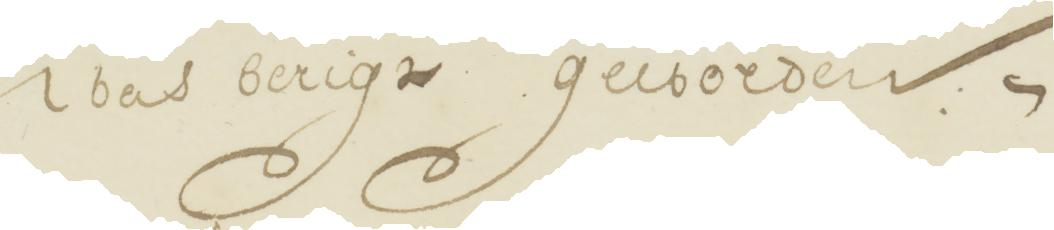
was berigt geworden:—
